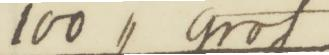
100 „ grof
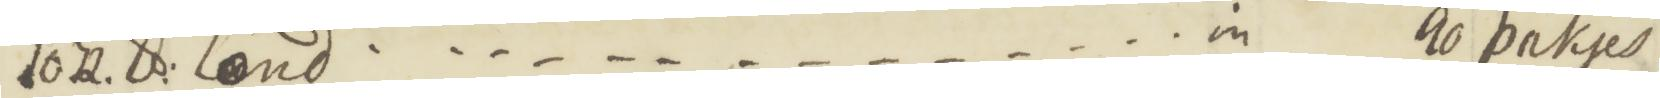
7072. lb: lond - - - - - - - - - - - - - - in 40 pakjes
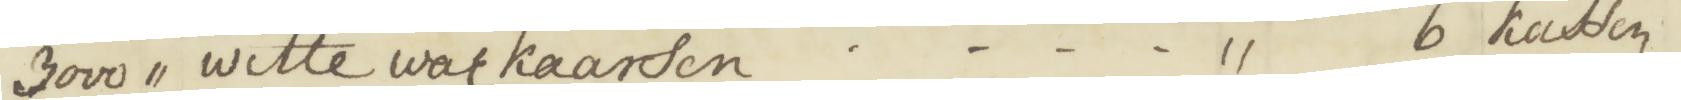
3000 „ witte wax kaarsen - - - - „ 6 kassen
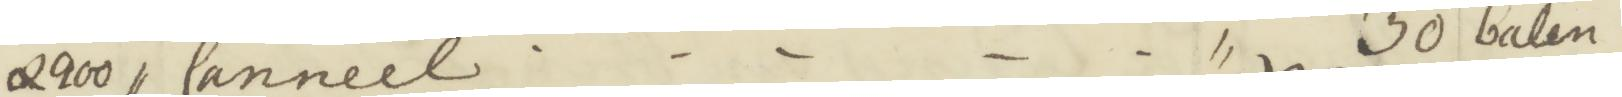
2400 „ Canneel - - - - - „ 30 balen
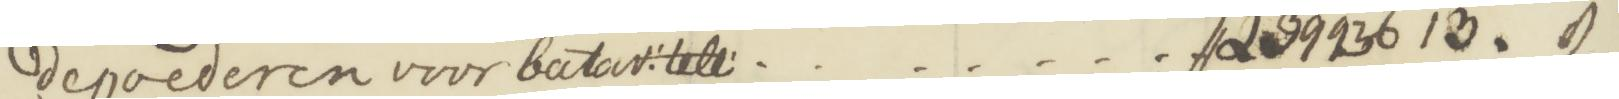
de goederen voor batav: tele: - - - - - - - „ 234436 13. 8
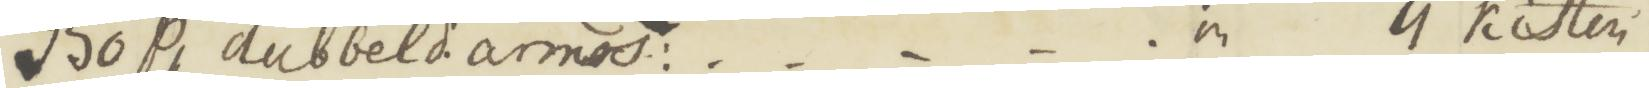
350 p„' dubbeld: armos: - - - - - in 4 kisten
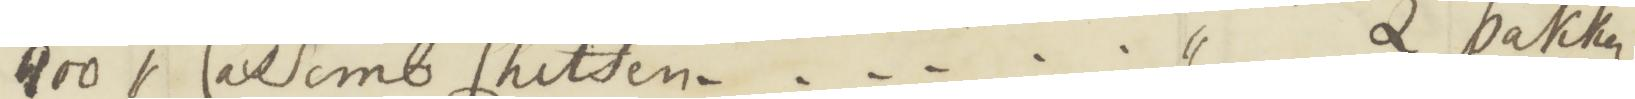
400 „ Cassemb Chitsen - - - - - - „ 2 pakken
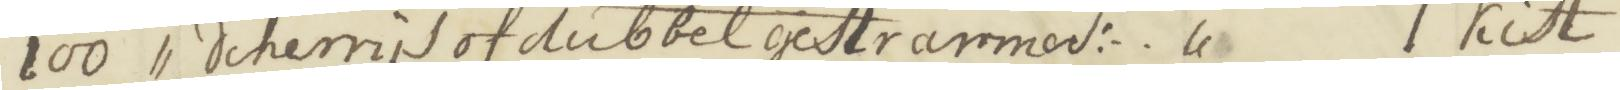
100 „ dscherrijs of dubbel gestr armos: - - „ 1 kist
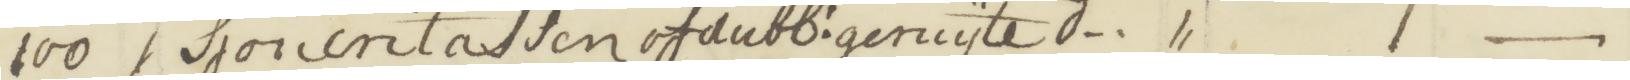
100 „ sjoucritassen of dubb: geruijte d - - „ 1 —
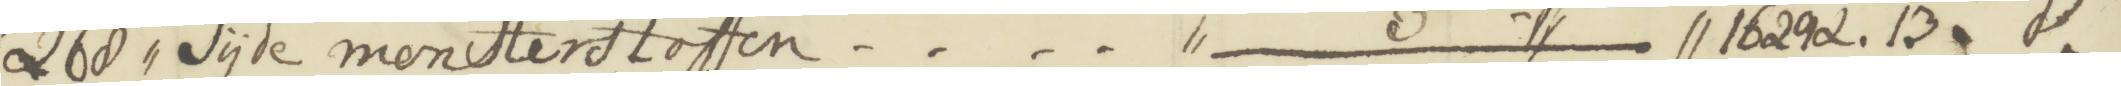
268 „ sijde monsterstoffen - - - - „ 3 -„ „ 16242. 13. 8.
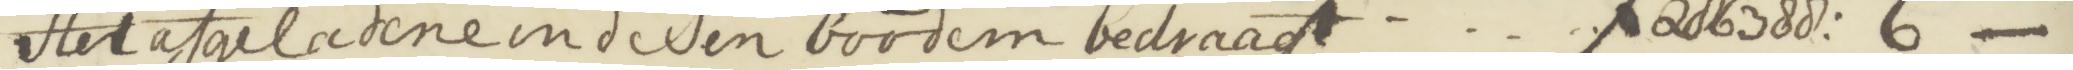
Het afgeladene in desen boodem bedraagt ƒ 286388: 6 —
